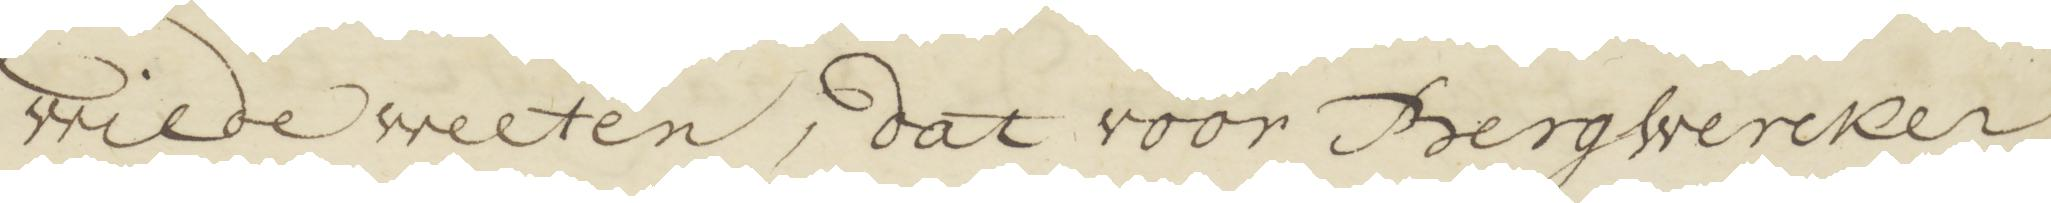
wilde weeten, dat voor Bergwercker
